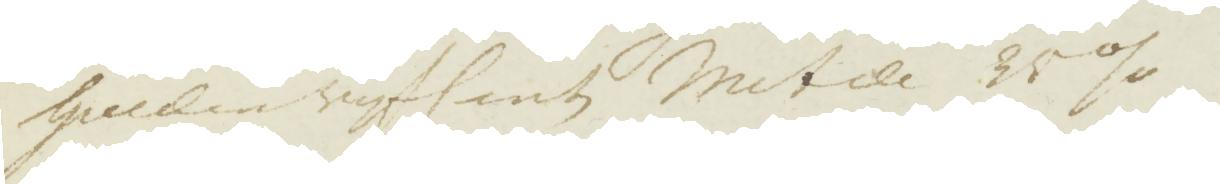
Gulden vyf Cents Metde 35%
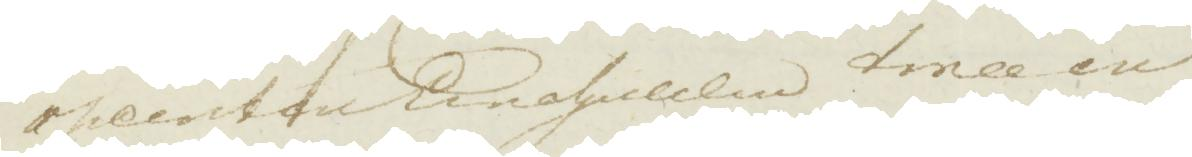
opcenten Eene Gulden twee en
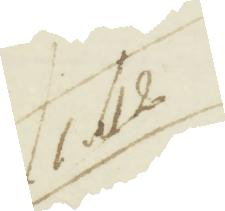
f 1.42
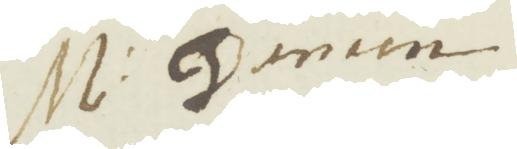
M: Danaen
